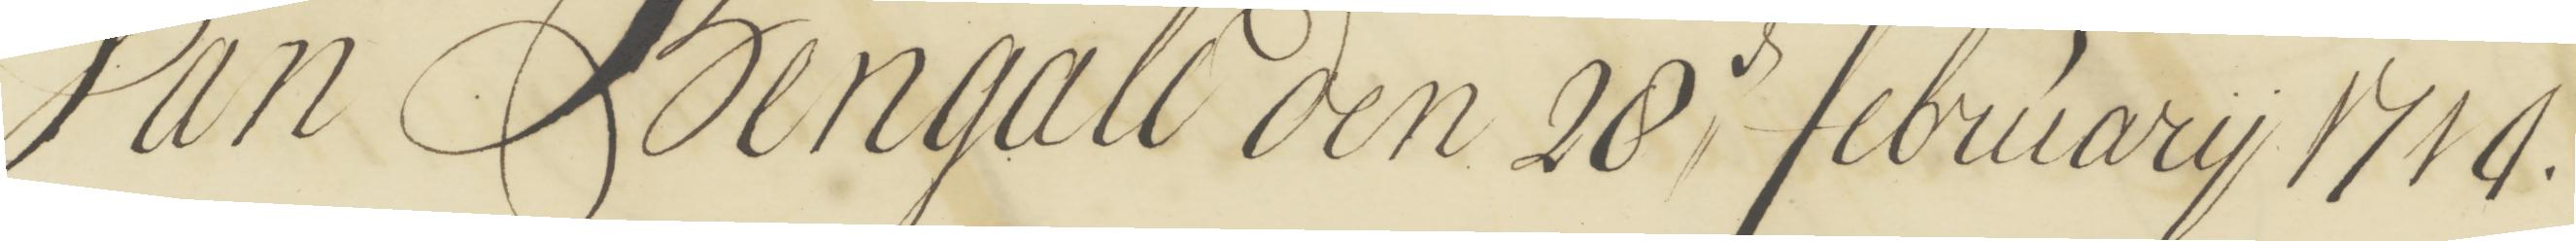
Van Bengale den 28„en Februarij 1714.
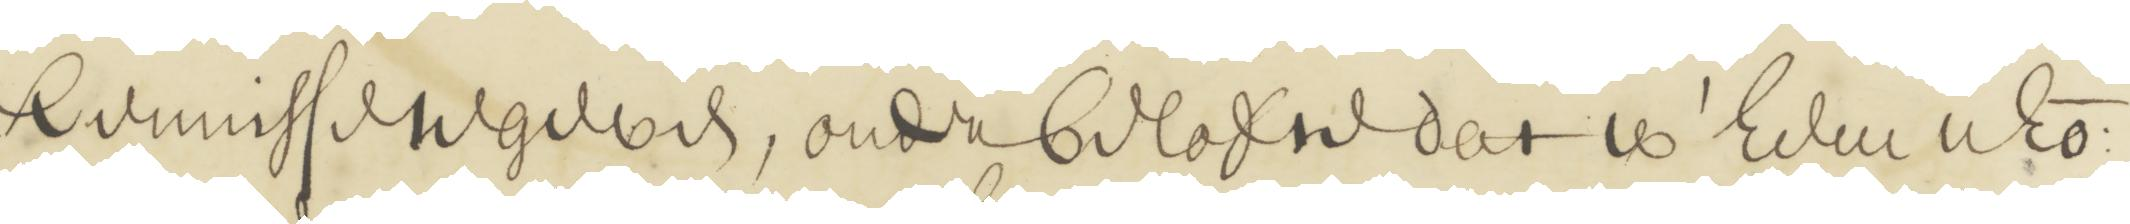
kennisse te geven, onder belofte dat w' hem u ho:
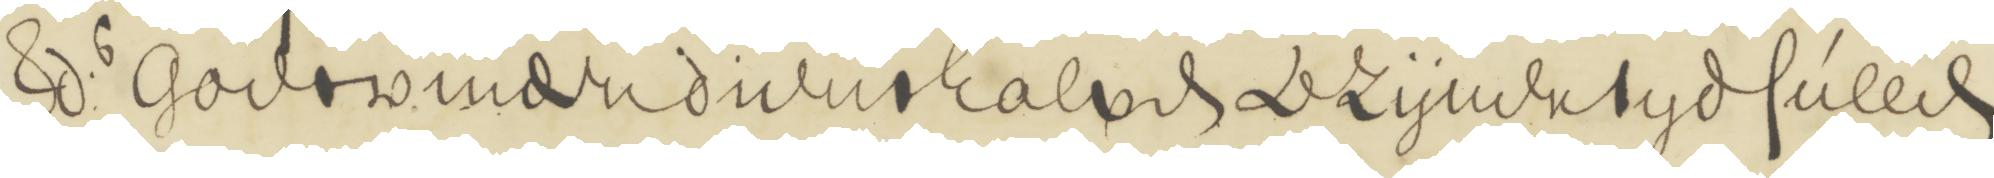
Ed:s Goetvinden dienthalven te zijner tyd sullen
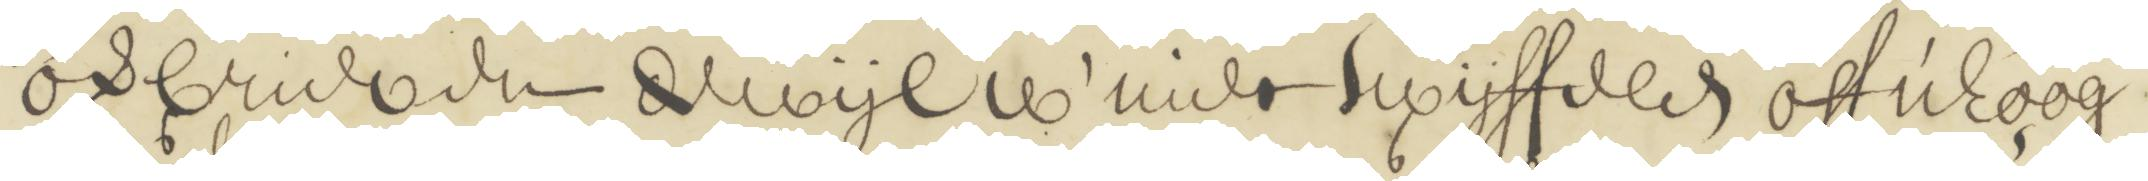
overbrieven dewijl w' niet twijffelen off uhoog
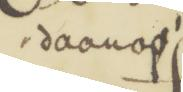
„daarop
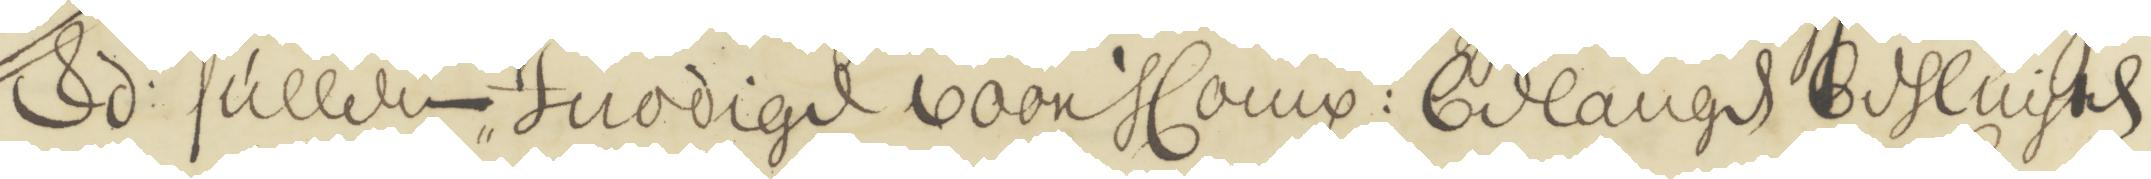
Ed:s sullen„ t nodige voor 's Comp:s belangen besluijten
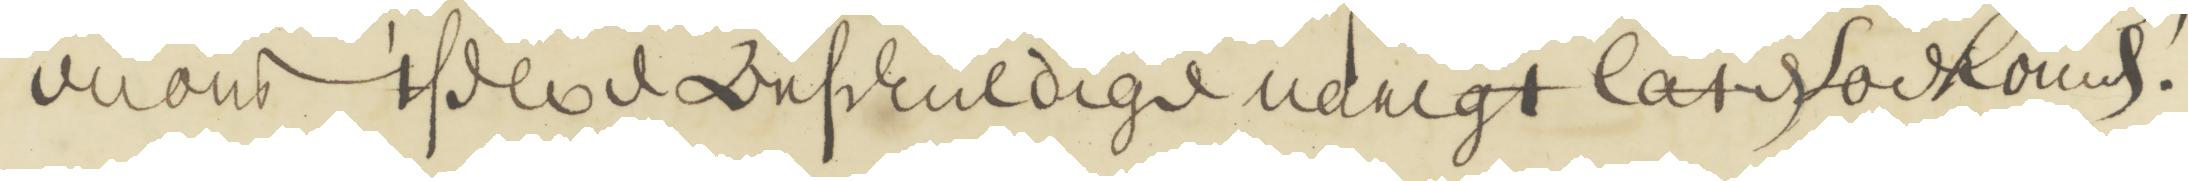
en ons 'tselve terschuldige narigt laten toekomen.
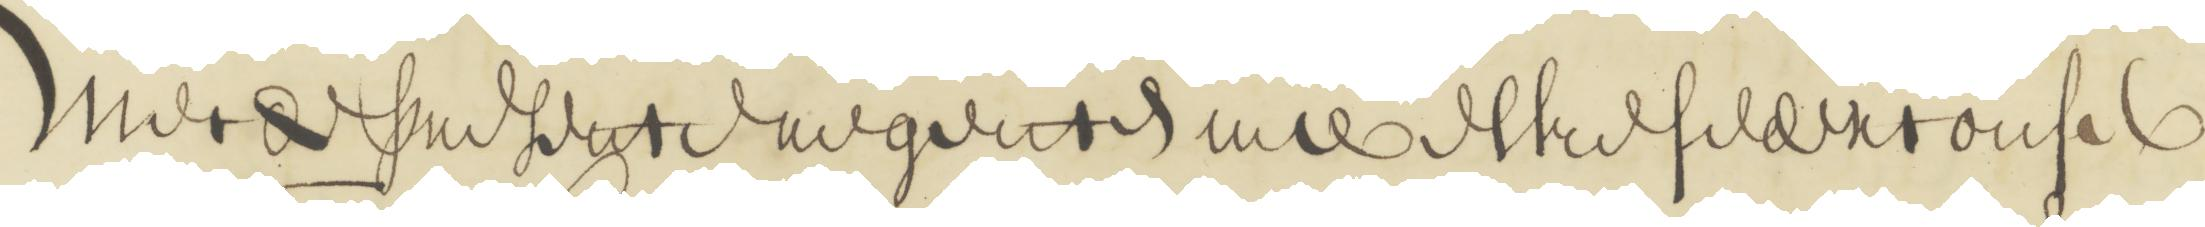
Met de presente regenten in welke sedert onse
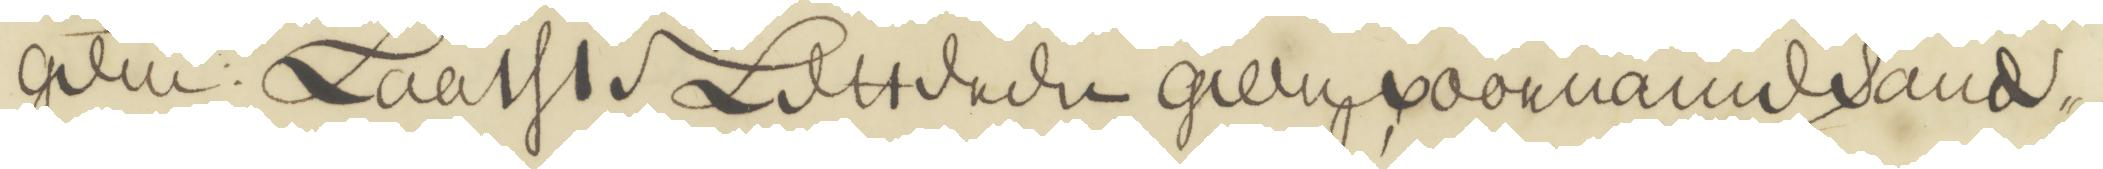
gem: Laatste Letteren geen voorname verande„
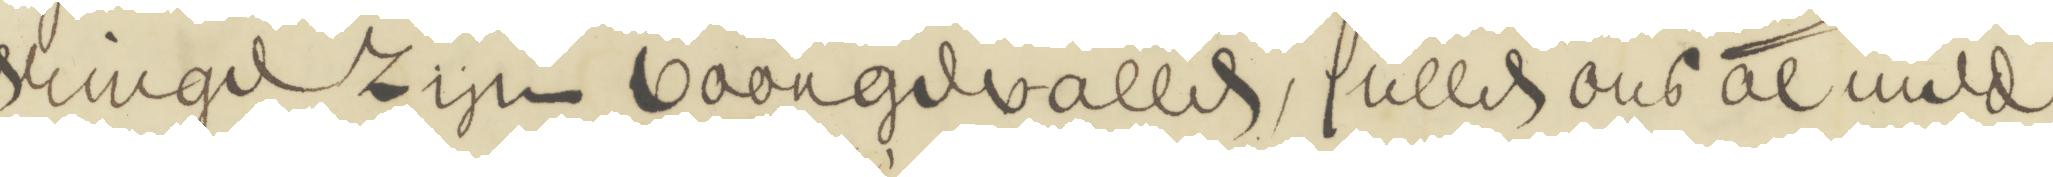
ringe zijn voorgevallen, sullen ons al mede
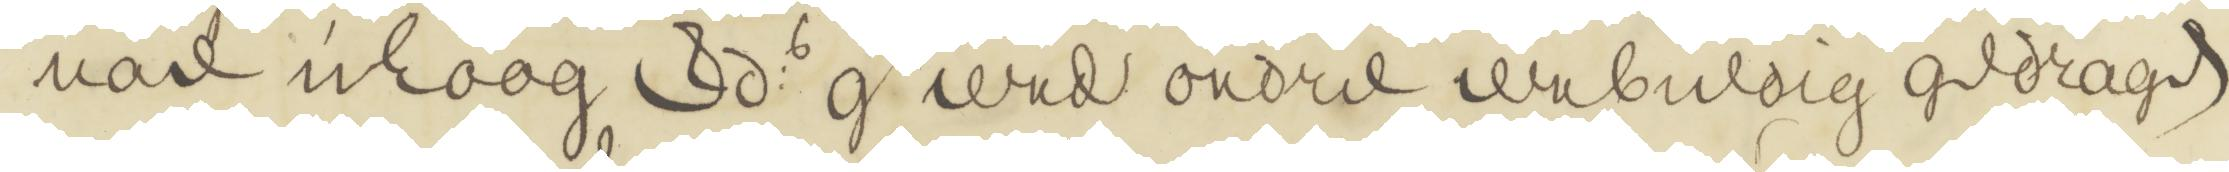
nae uhoog Ed:s g’eerde ordre eerbiedig gedragen
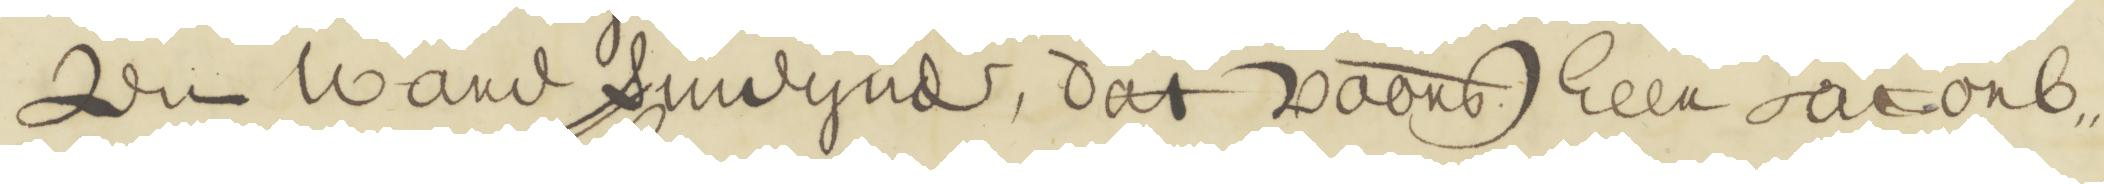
ten ware vermeynde, dat voors: heer sacorb„
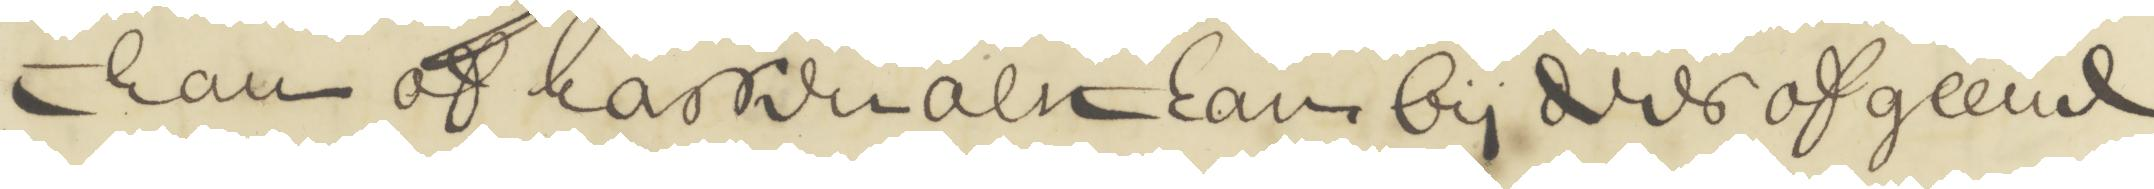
chan of hassen alichan bij dees of geene
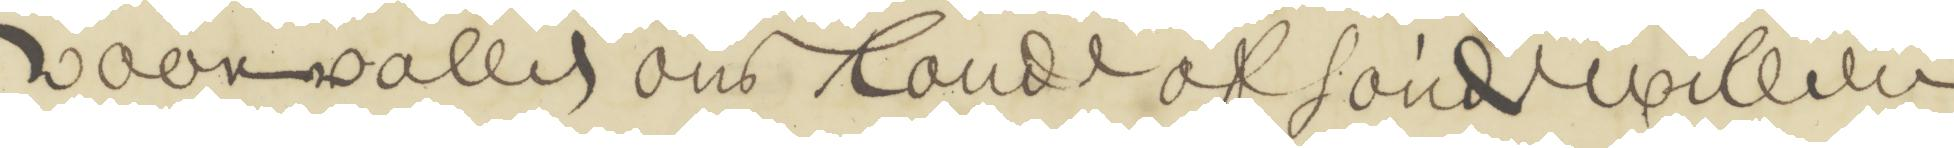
voorvallen ons konde of soude willen
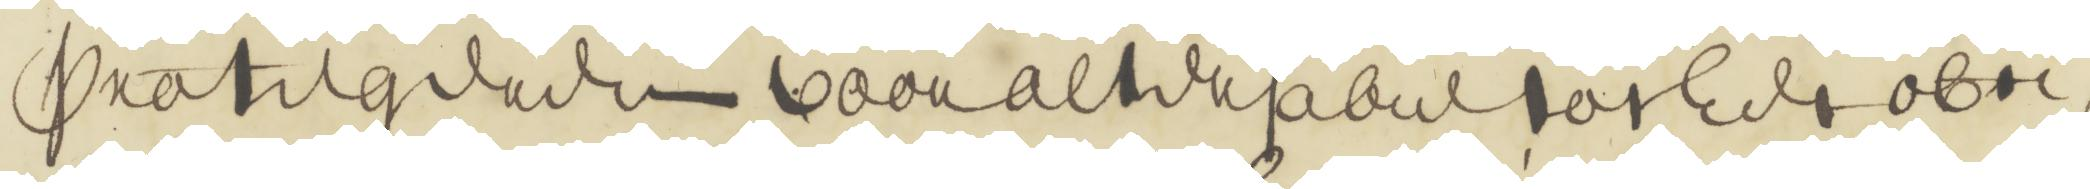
Protegeren voor altersabie tot het obti
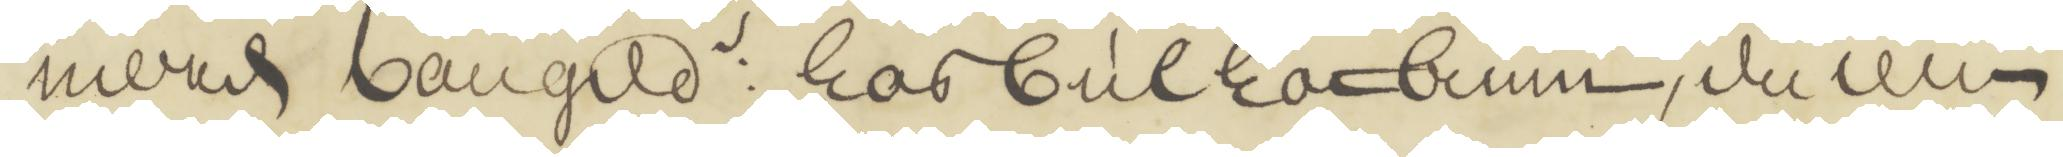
neeren van ged:e hasbul hackbium, en een
